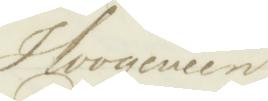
Hoogeveen
